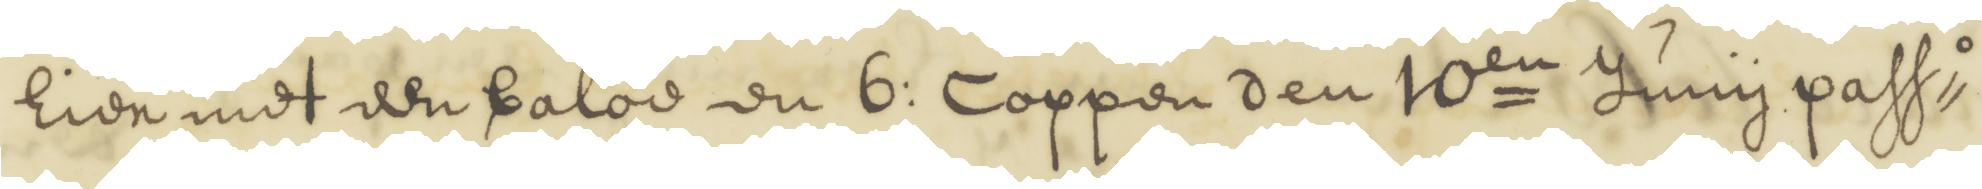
hier met een baloe en 6: Coppen den 10=en Junij pass„o
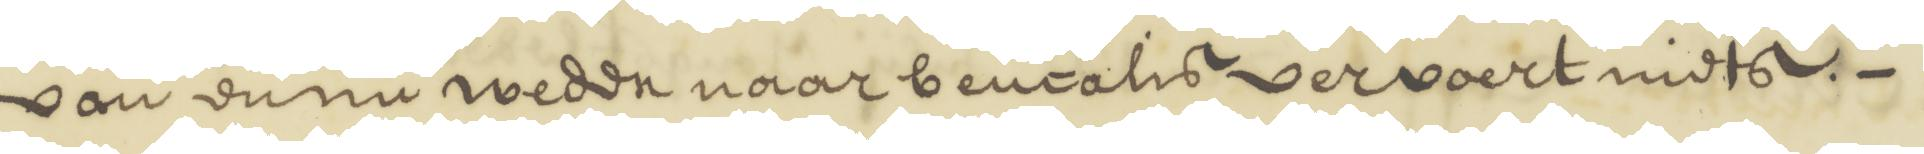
van en nu weder naar bencalis vervoert niets. —
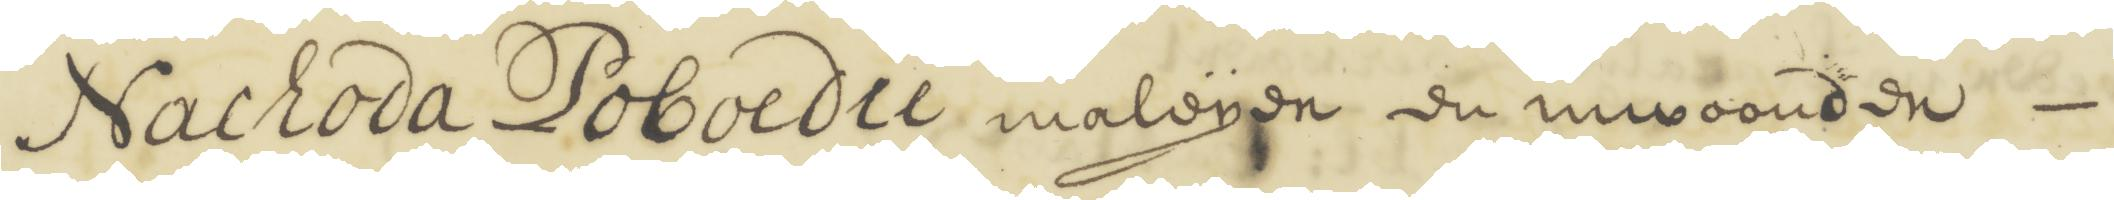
Nachoda Poboedie maleijer en inwoonder —
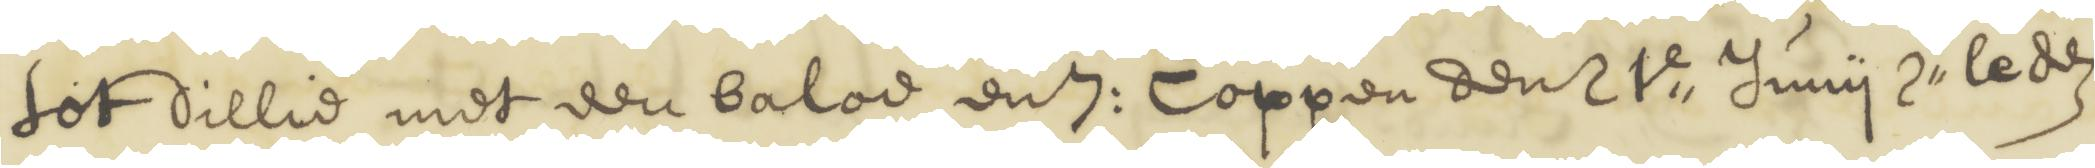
tot dillie met een baloe en 7: Coppen den 21„e Junij j„o lede
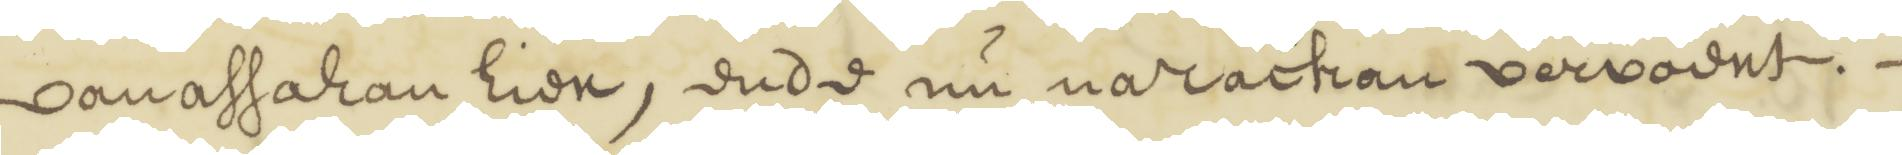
van assahan hier, ende nu na rackan vervoert. —
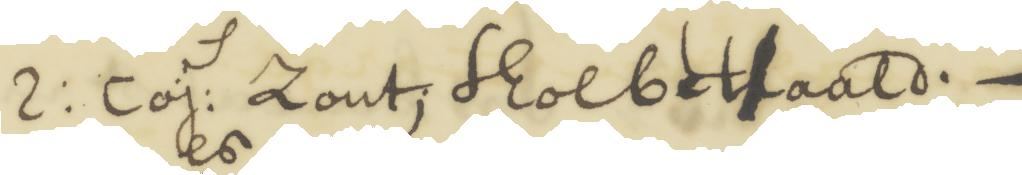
2: Coj:s zout; thol bettaald. —
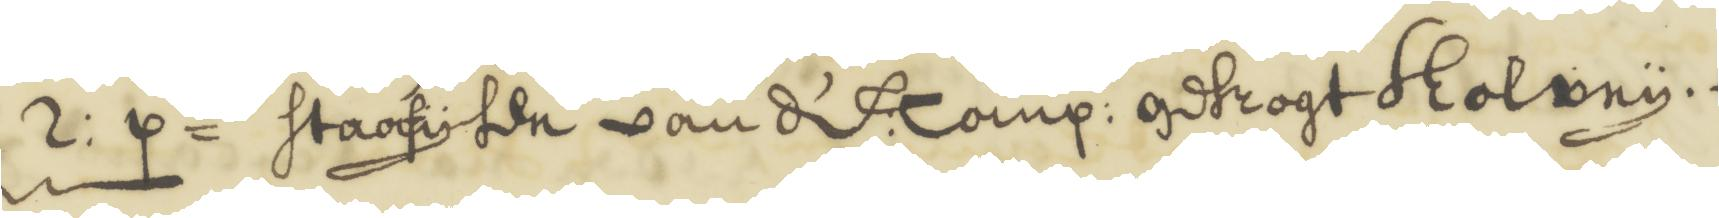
2: p=ls staafijser van d’ E: Comp: gekogt tholvrij.
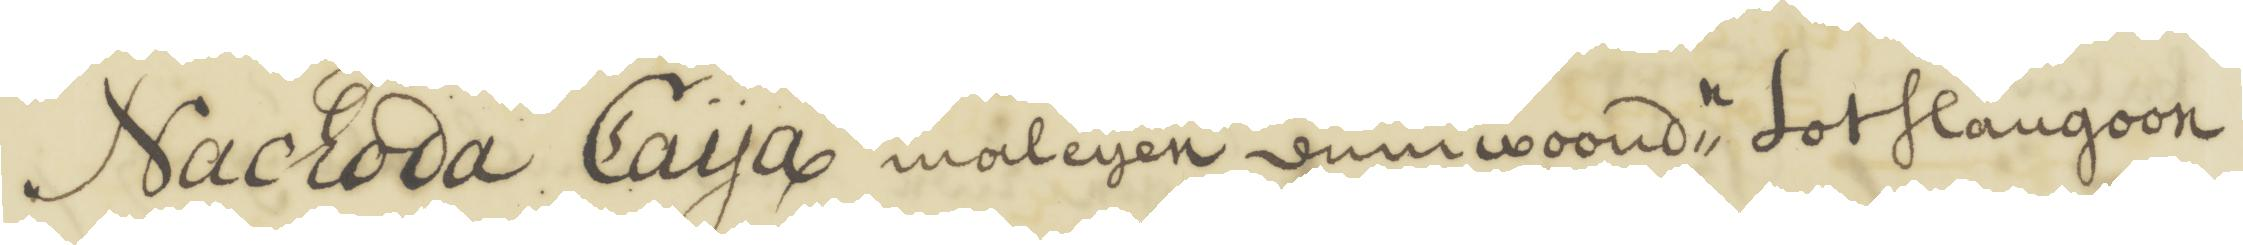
Nachoda Caija maleijer en inwoond„r tot slangoor
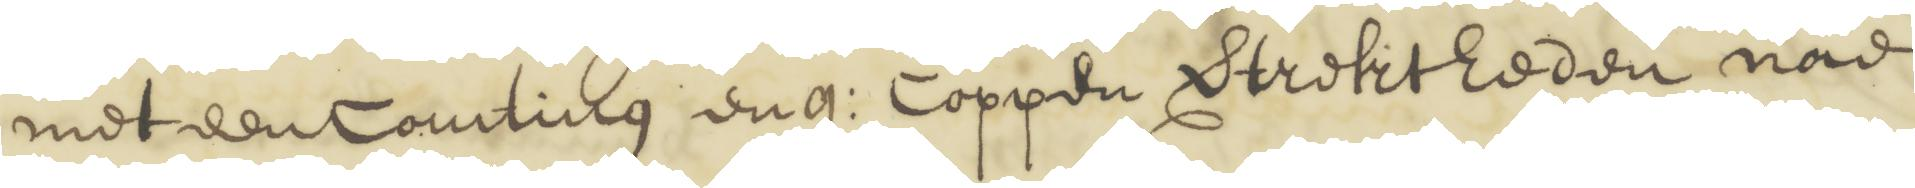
met een Comting en 9: Coppen vertrekt heden nae
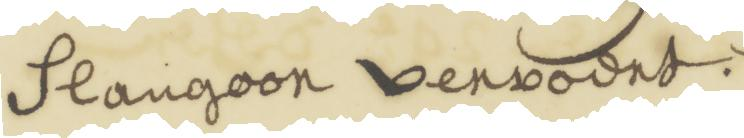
Slangoor vervoert.
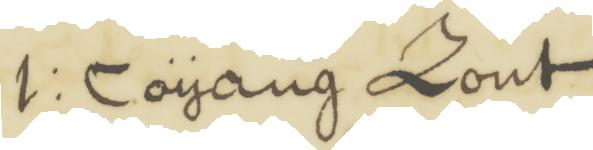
1: Coijang zout
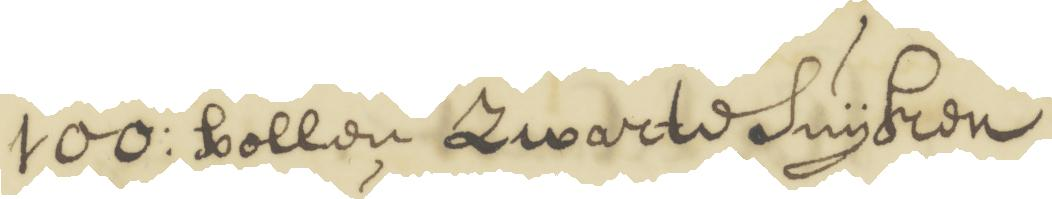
100: bollen zwarte suijker
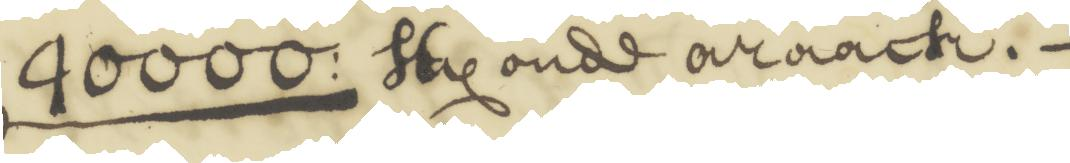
40000: stx oude araack. —
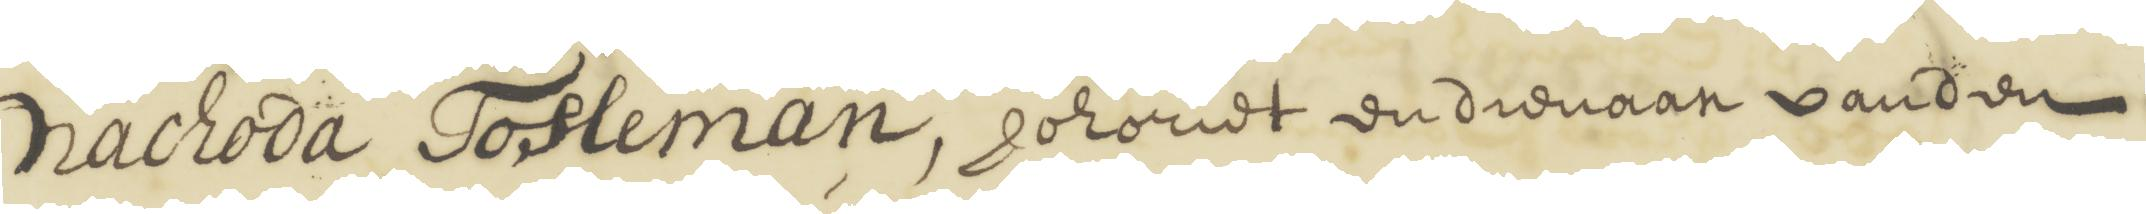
Nachoda Tosleman, johoriet en dienaar van den
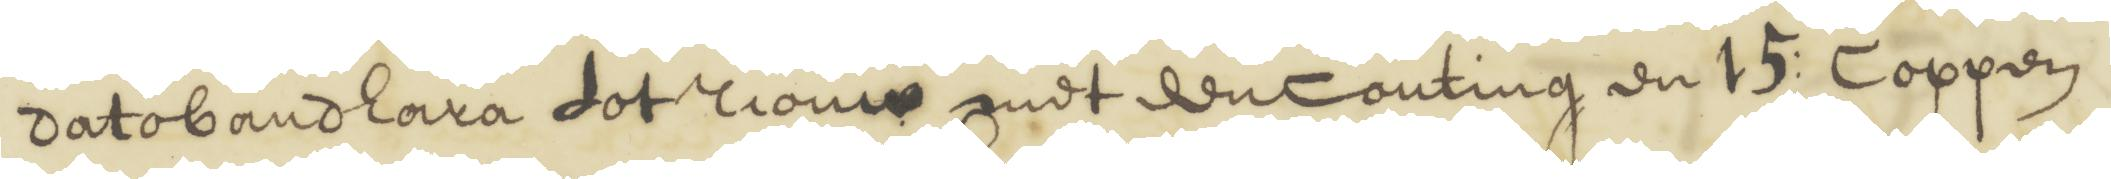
datobandhara tot Riouw met een conting en 15: Coppen
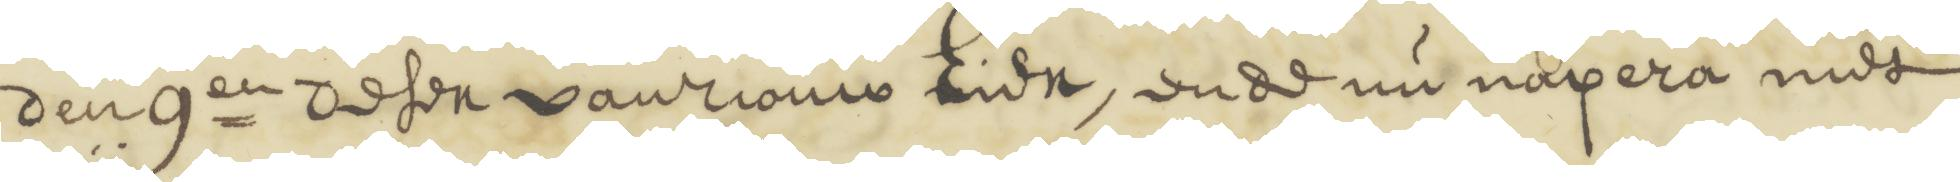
den 9=en deser van riouw hier, ende nu napera met
